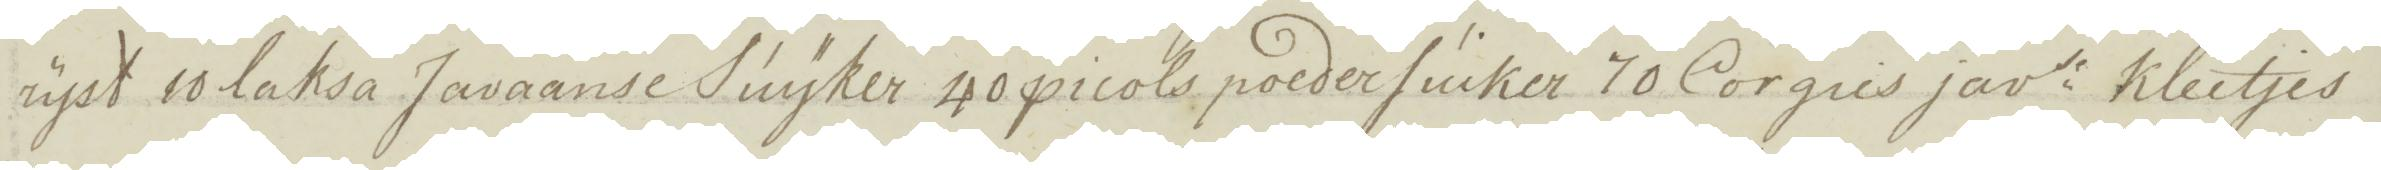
rijst 10 laksa Javaanse Suijker 40 picols poedersuiker 70 Corgies jav„se kleetjes
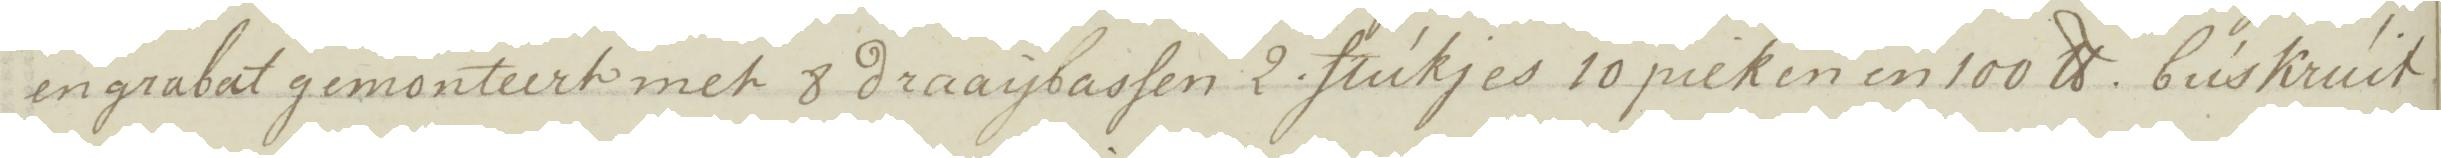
en grabat gemonteert met 8 draaijbassen 2. stukjes 10 pieken en 100 lb. bus kruit
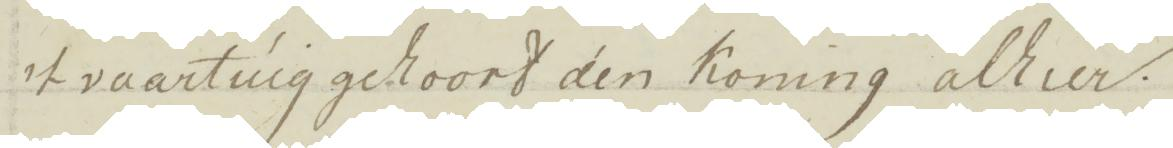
't vaartuig gehoort den Koning alhier.
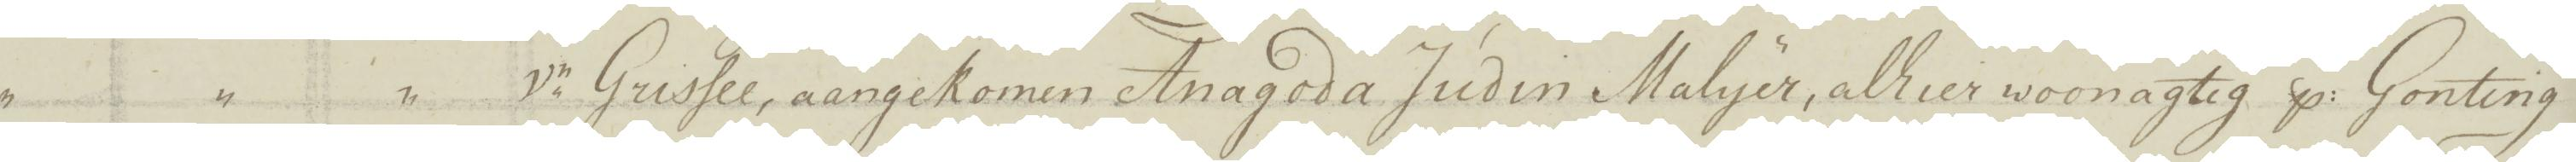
„ „ „ v:n Grissee, aangekomen Anagoda Judin Malijer, alhier woonagtig p: Gonting
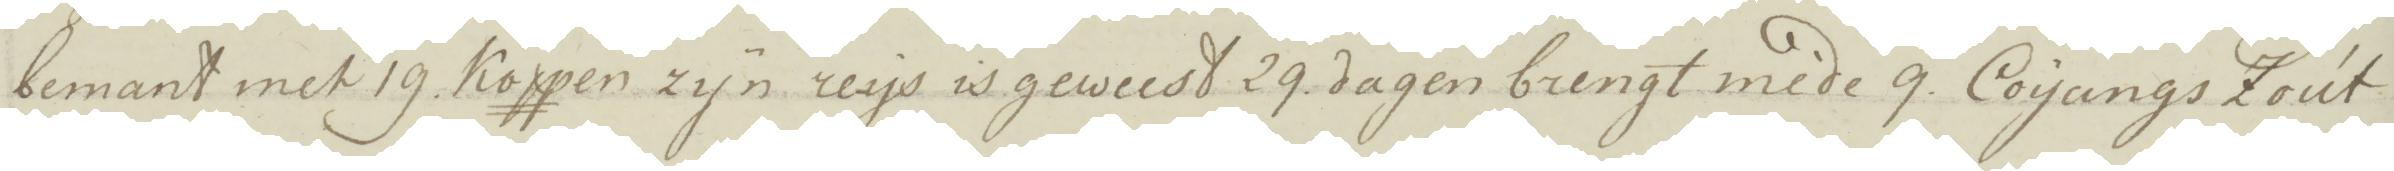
bemant met 19. koppen zijn reijs is geweest 29. dagen brengt mede 9. Coijangs zout
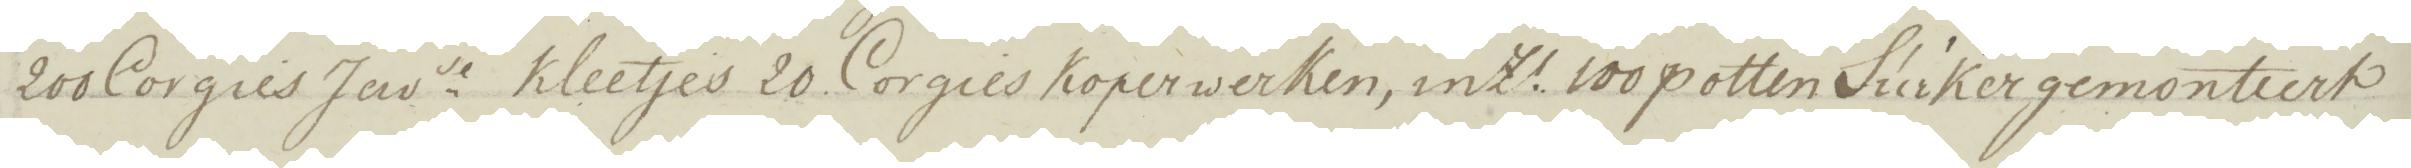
200 Corgies Jav-se kleetjes 20. Corgies koperwerken, inz„t 100 potten suiker gemonteert
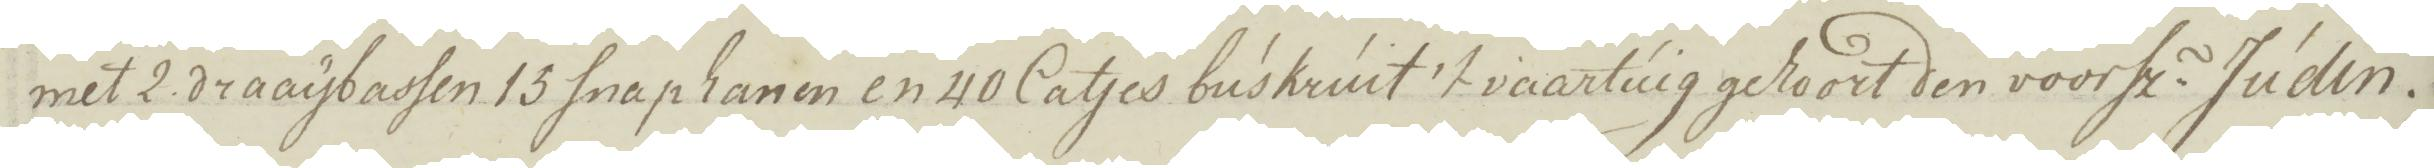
met 2. draaijbassen 15 snaphanen en 40 Catjes buskruit ’t vaartuig gehoort den voors. Judin.
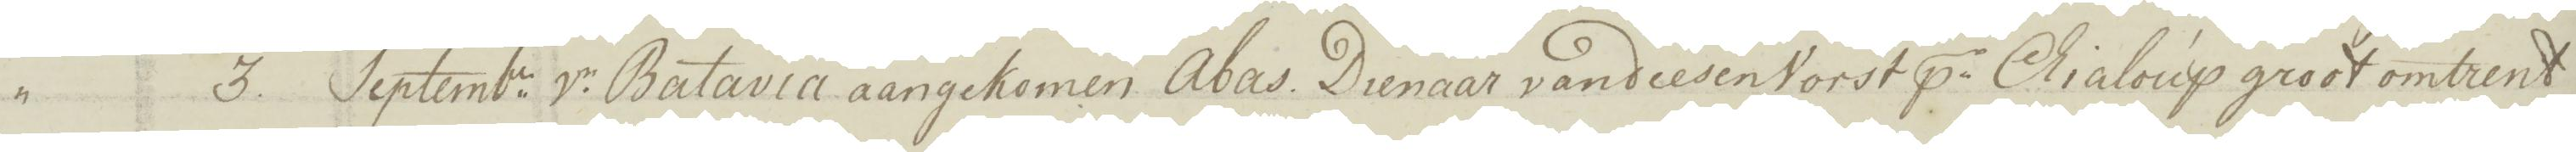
„ 3. Septemb„r v.n Batavia aangekomen Abas. Dienaar van deesen vorst p=r Chialoup groot omtrent
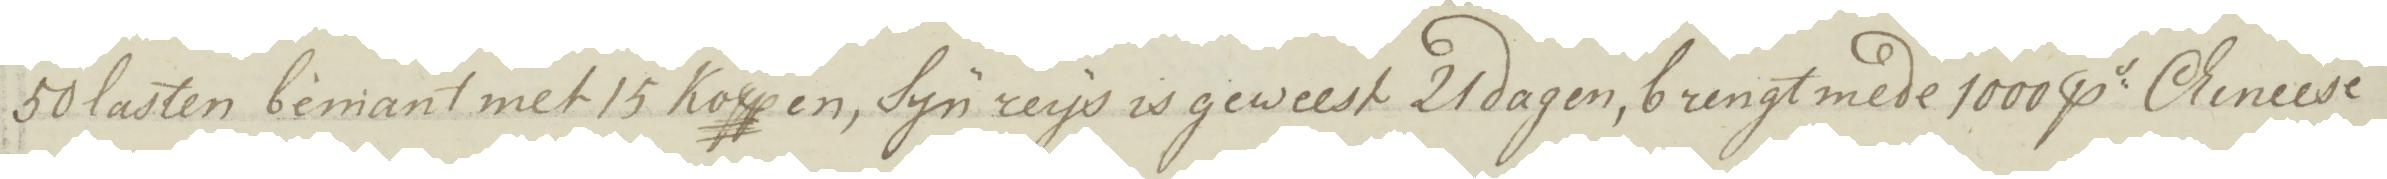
50 lasten bemant met 15 koppen, sijn reijs is geweest 21 dagen, brengt mede 1000 p„s Chineese
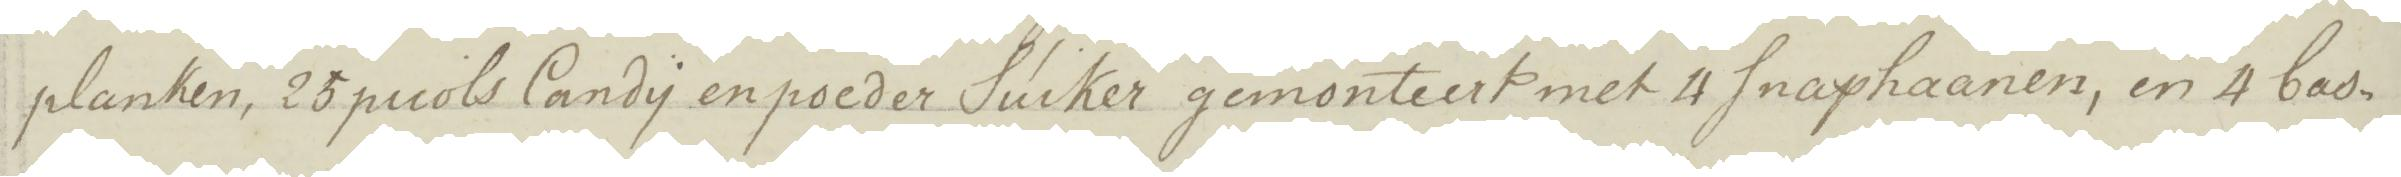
planken, 25 picols Candij en poeder suiker gemonteert met 4 snaphaanen, en 4 bas„
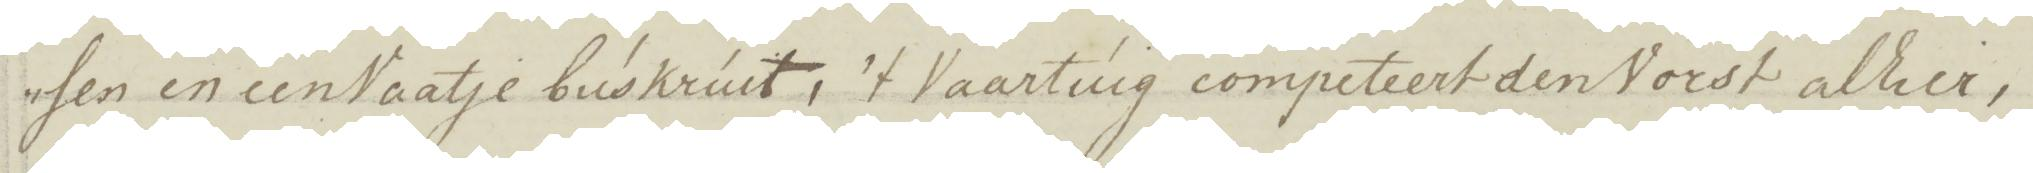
„sen en een vaatje buskruit, ’t vaartuig competeert den vorst alhier,
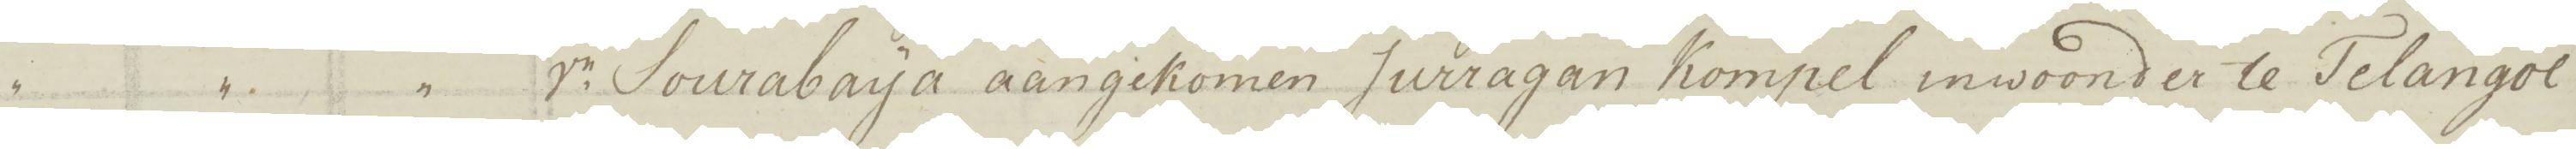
„ „ „ v:n Sourabaija aangekomen Jurragan Kompel inwoonder te Telangol
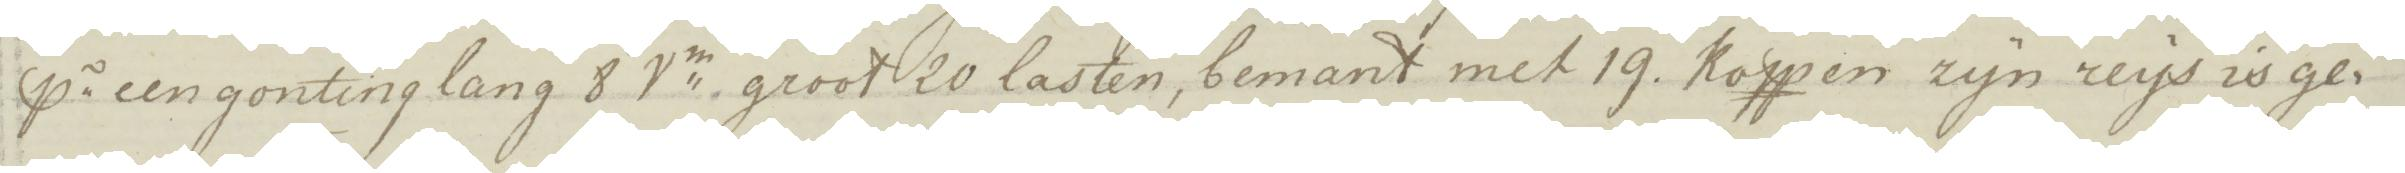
p„r een gonting lang 8 v„m groot 20 lasten, bemant met 19. koppen zijn reijs is ge„
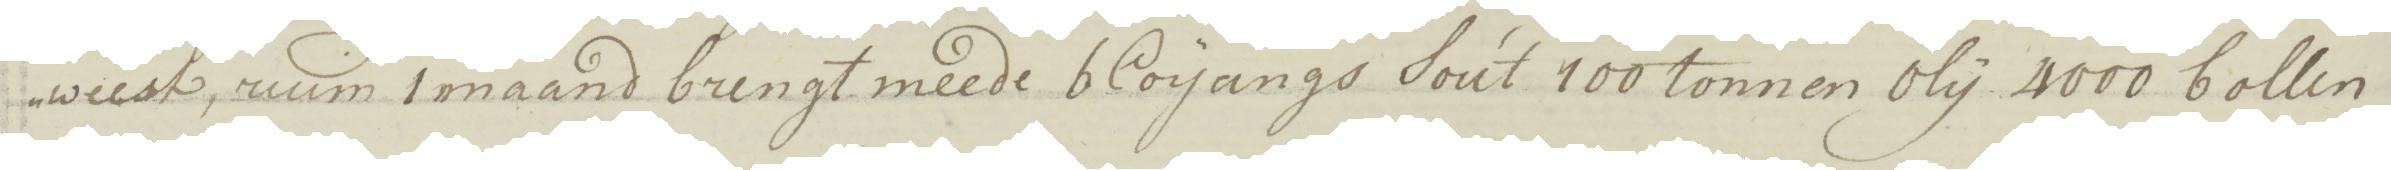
„weest, ruim 1 maand brengt meede 6 Coijangs sout 100 tonnen olij 4000 bollen
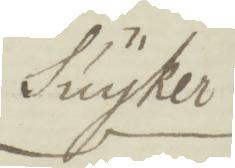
suijker
